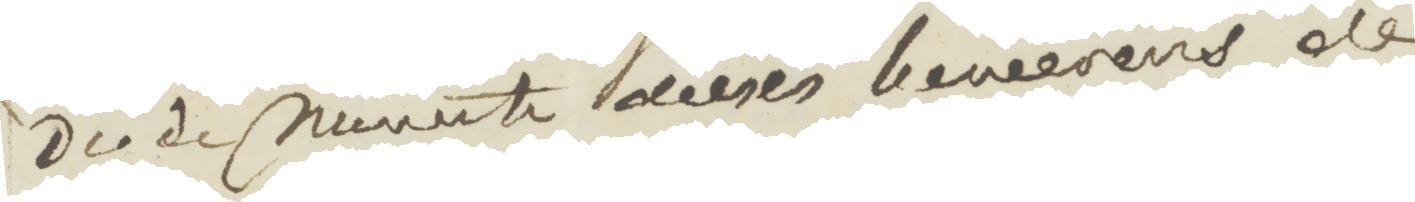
Die de minute deeses beneevens de
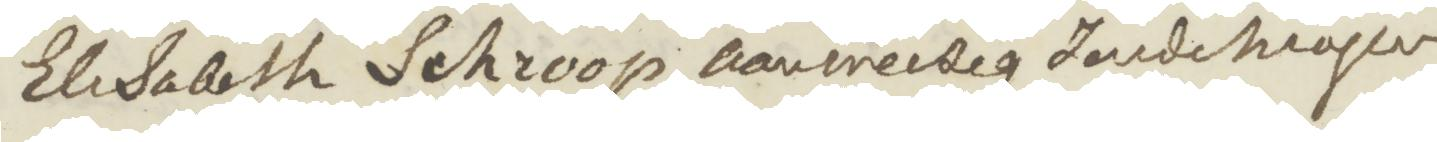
Elisabeth Schroop aanweezig zoude mogen
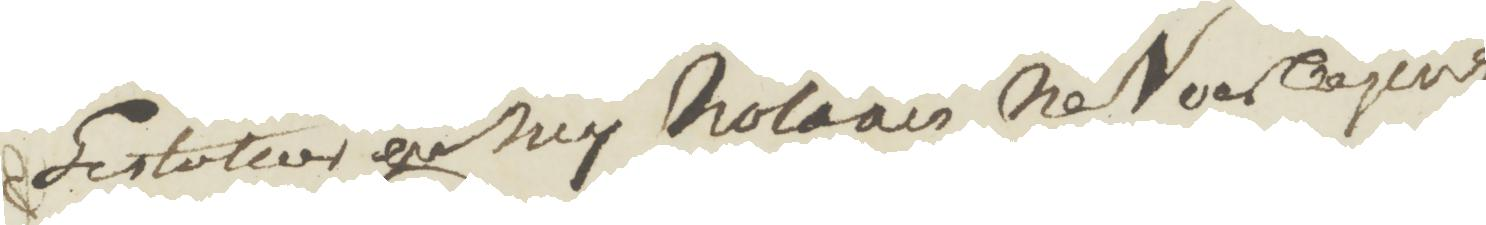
Testateur en my Notaris Crajing
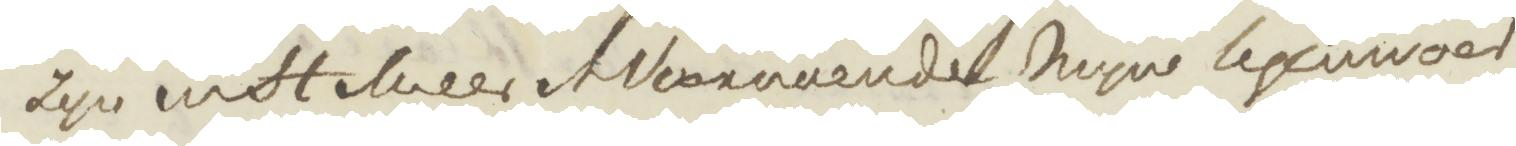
zyn inst meest myne tegenwoor
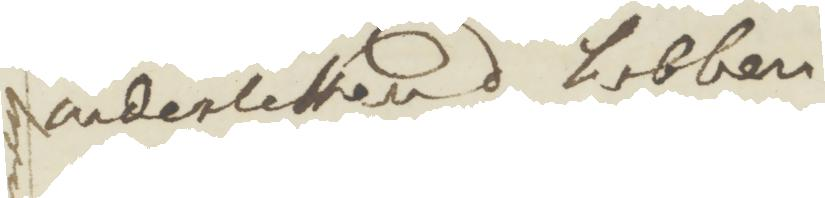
ondertekend hebben
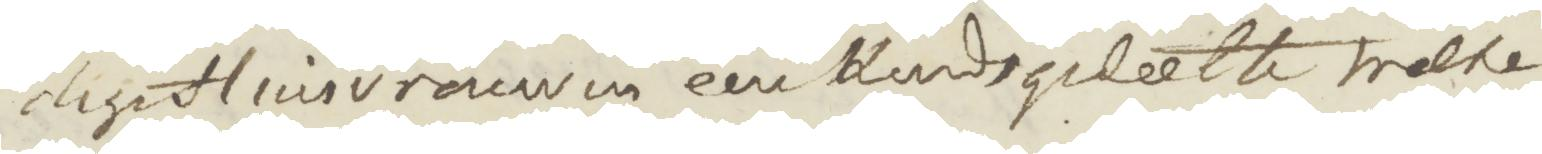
dige Huisvrouw een kindsgedeelte welke
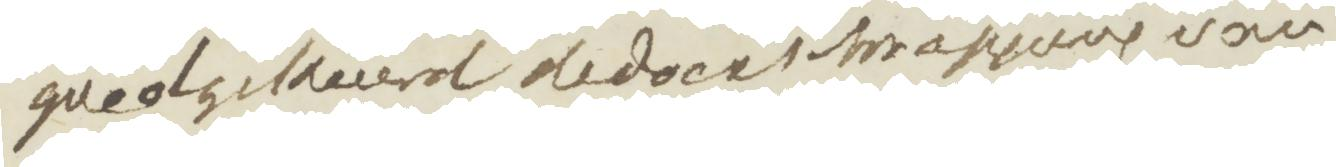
goedgekeurd de doors mapping van
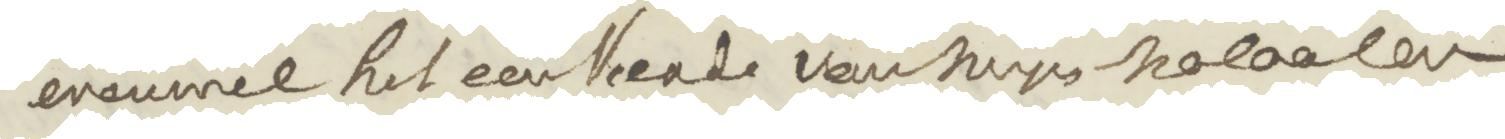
evenwel het een een Vierde van myn nalaaten
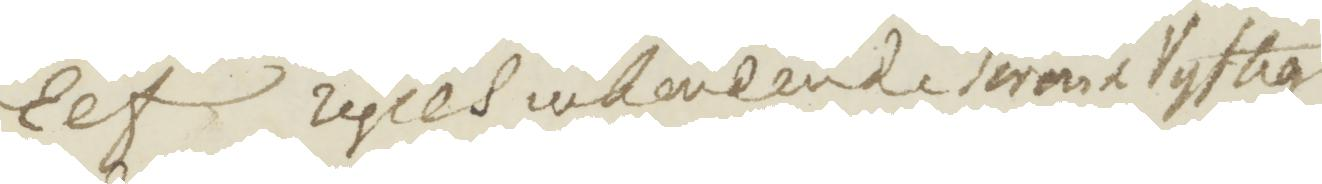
Eet regels rekenden de seven & vyftig
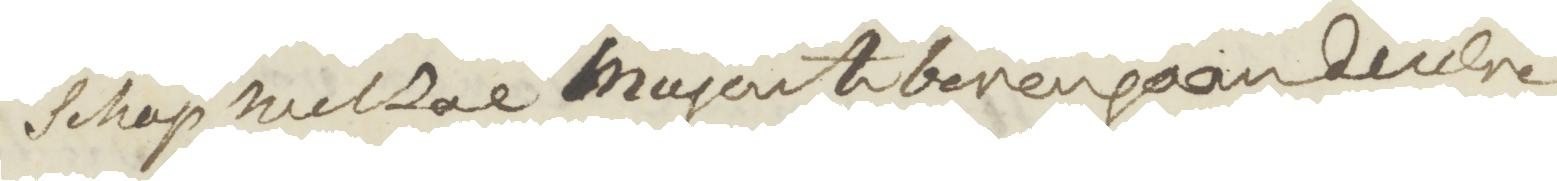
schap wel zal mogen te boven gaan deselve
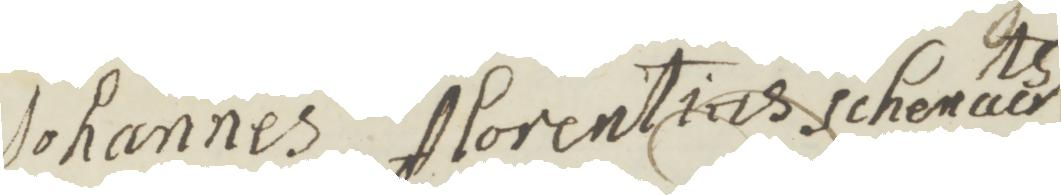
Johannes Horentius Schenaerts
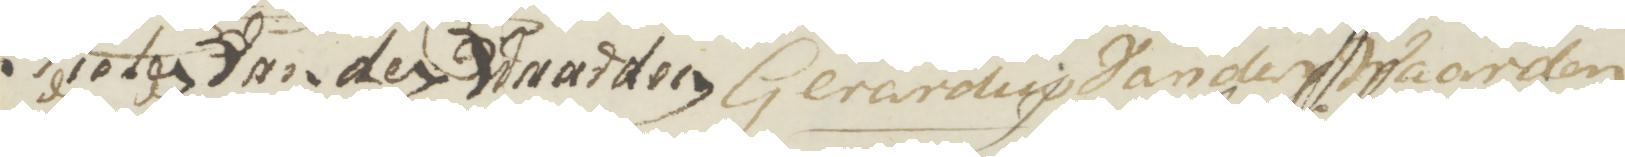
ieter Van den Waarden Gerardus Van den Waarden
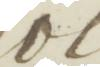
ol
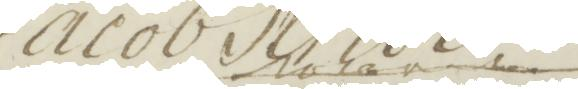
Jacob notaris
